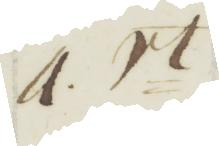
4. v=t
